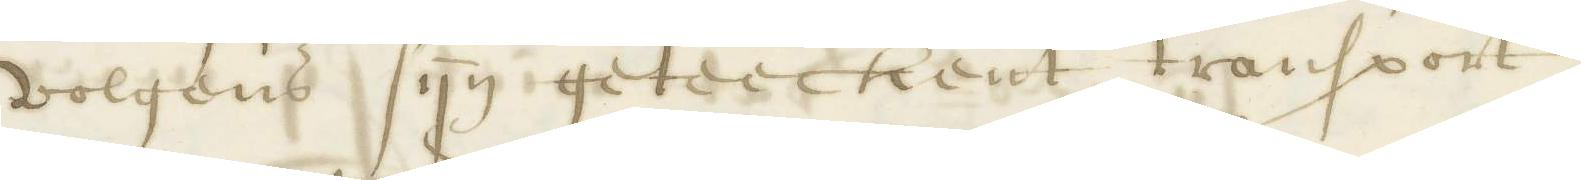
volgens sijn geteeckent transport
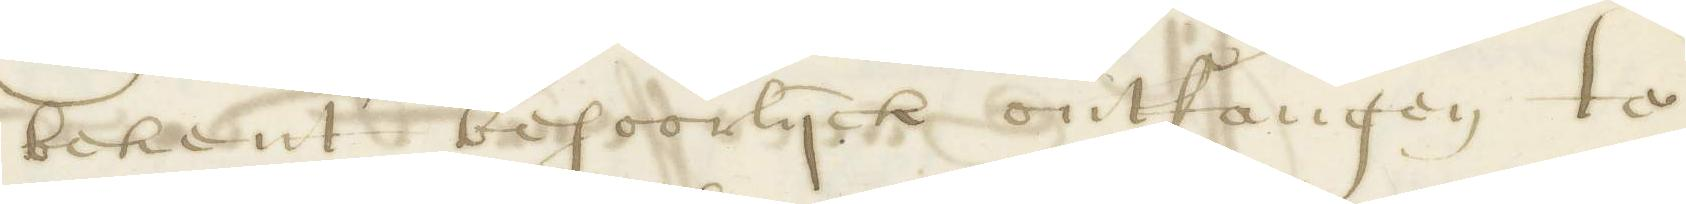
bekent behoorlijck ontfangen te
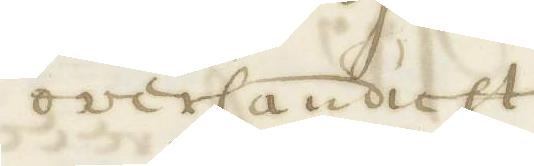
overhandicht
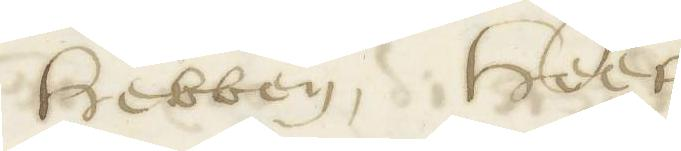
hebben, heef
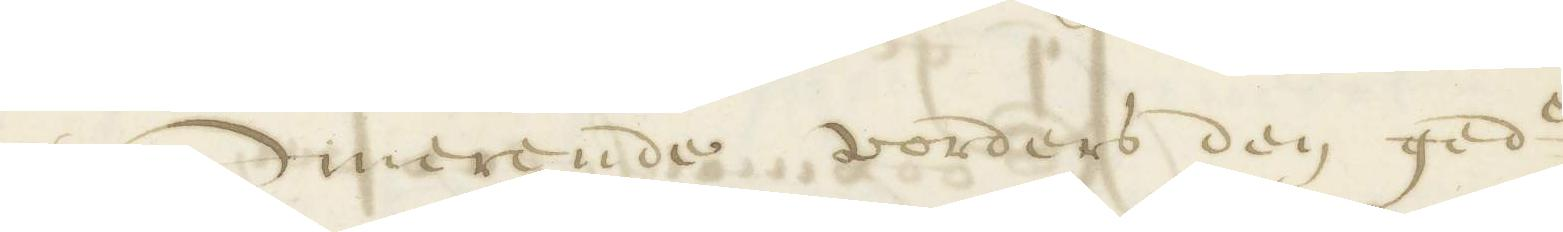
Sustinerende vorders den ged=e
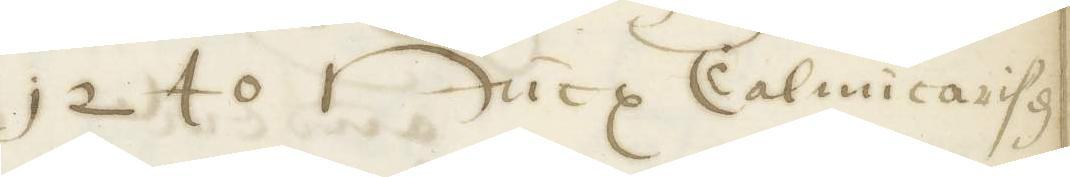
1240 stucx Calmicarisen
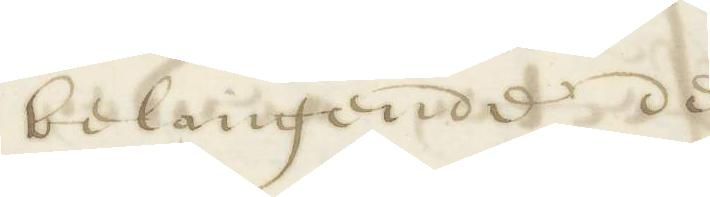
belangende de
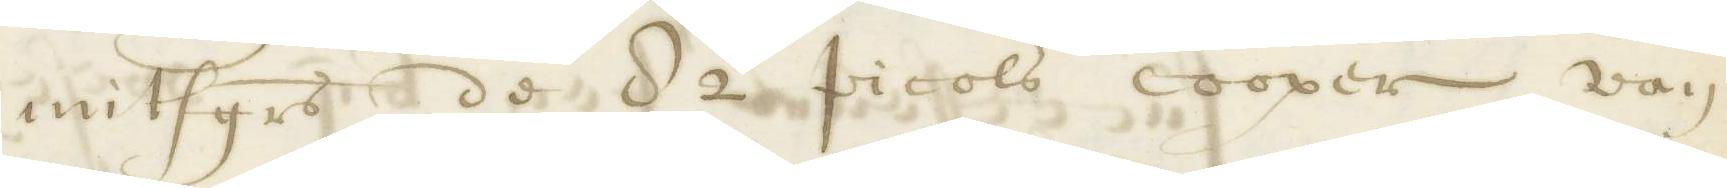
mitsgrs de 82 picols cooper van
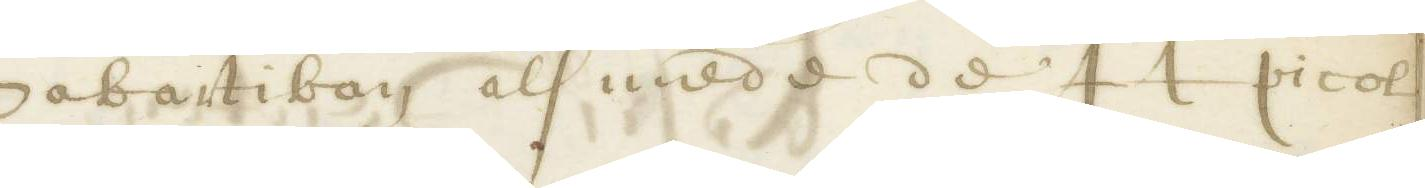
Sabartiban als mede de 44 picol
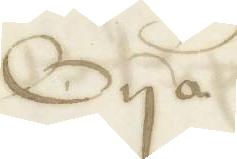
Oija
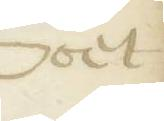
Soet
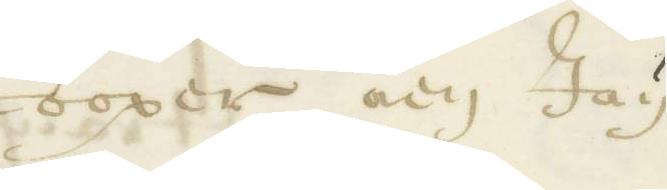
cooper aen Jan
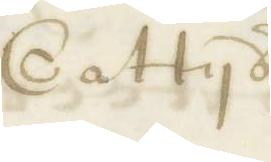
Cattijs
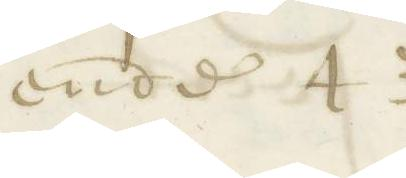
ende 43
